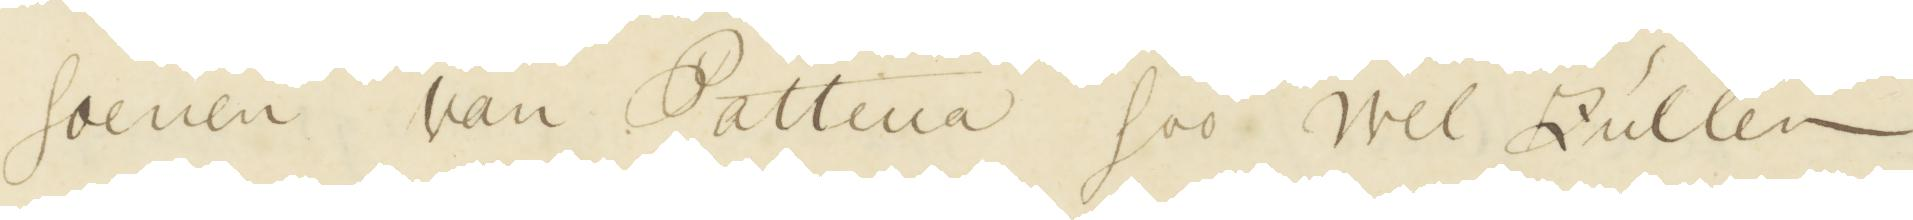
soenen van Pattena soo wel zullen
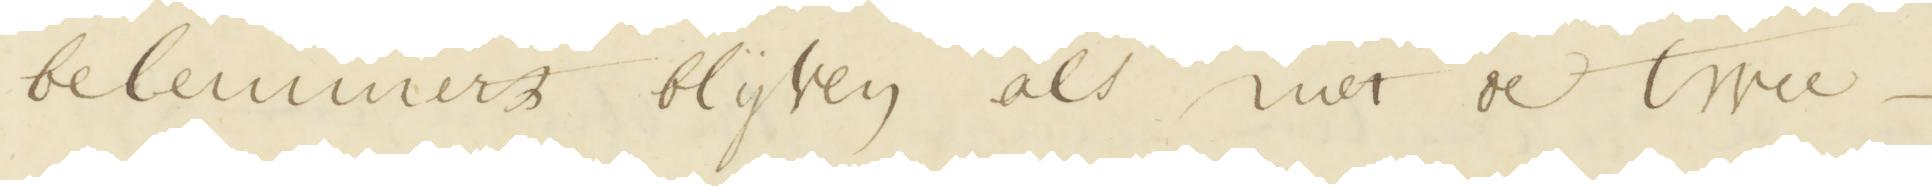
belemmert blijven als met de twee -
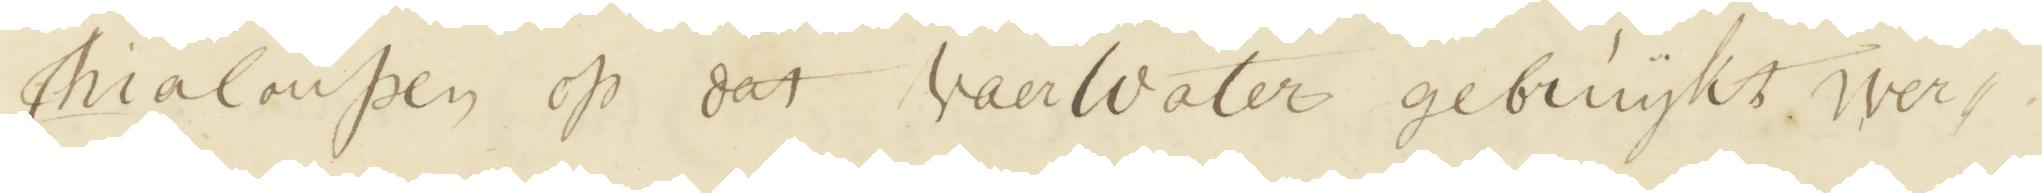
Chialoupen op dat vaerwater gebruijkt wer„
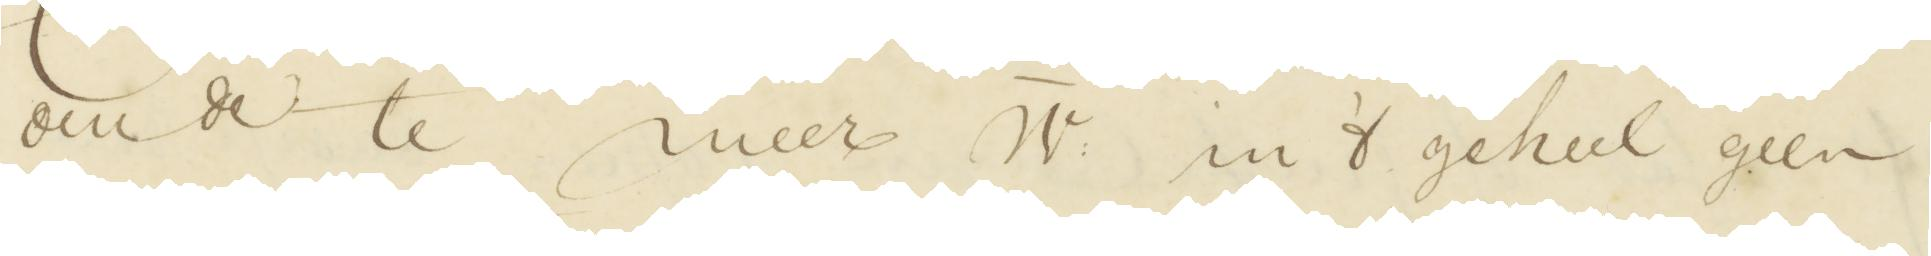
den de te meer W: in ’t geheel geen
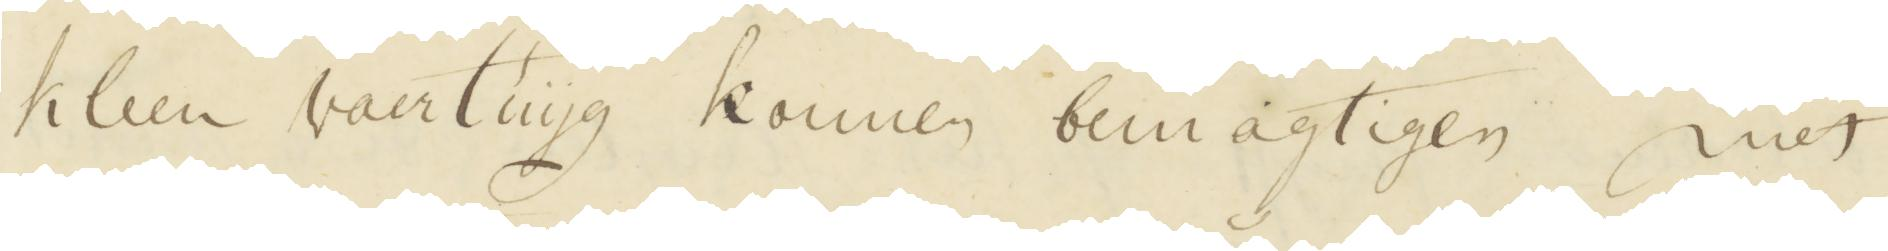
kleen vaertuijg konnen bemagtigen niet
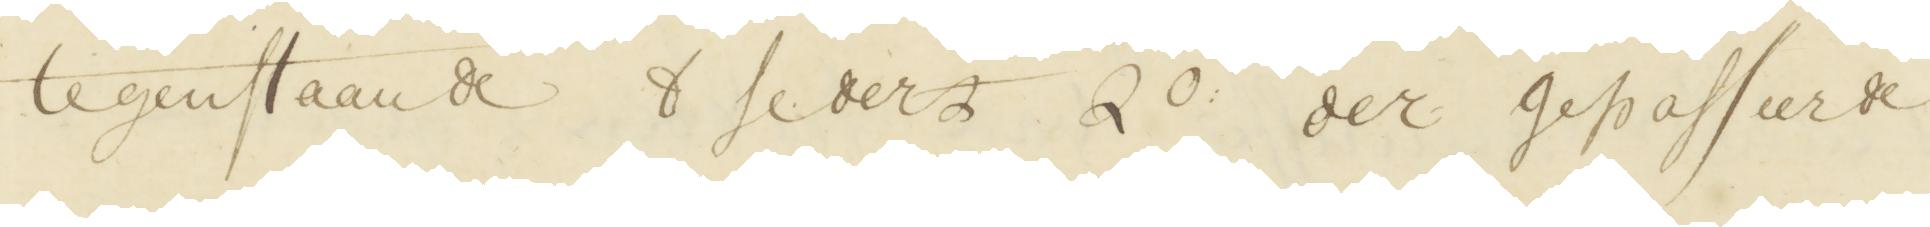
tegenstaande t sedert 20: der gepasseerde
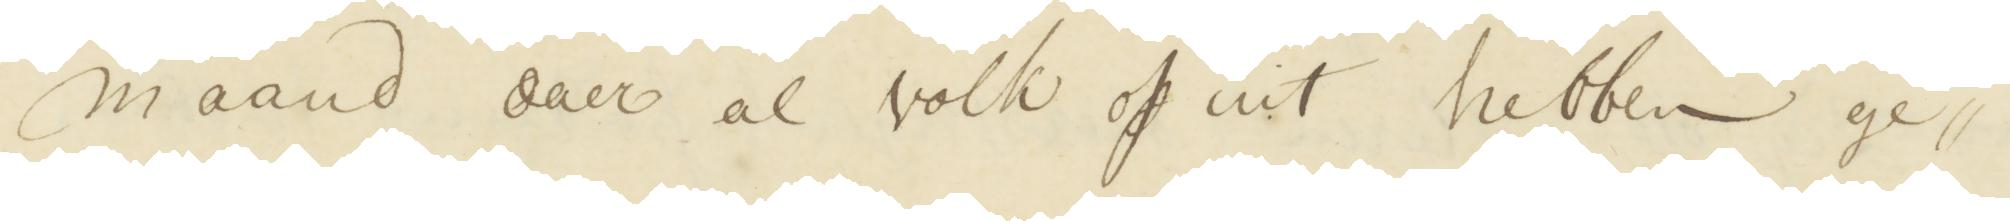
maand daer al volk op uit hebben ge„
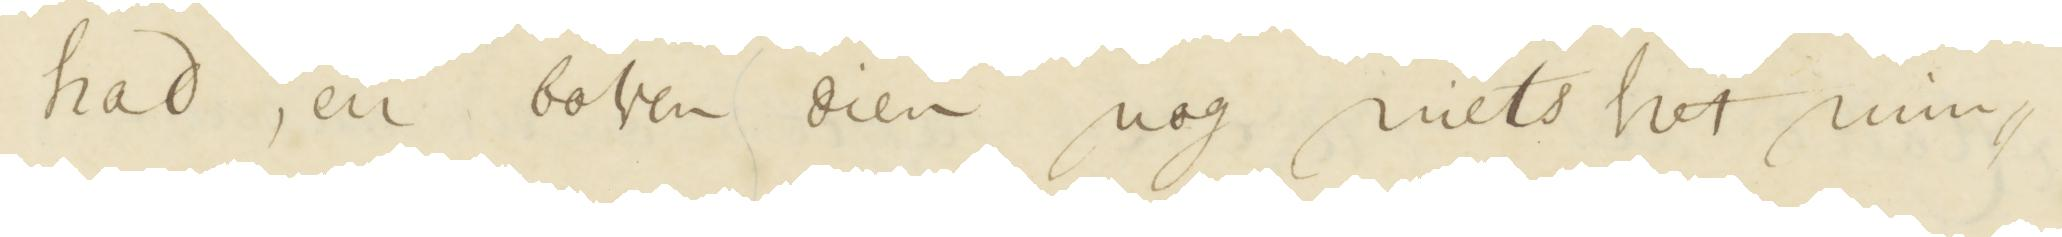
had, en boven dien nog niets het min„
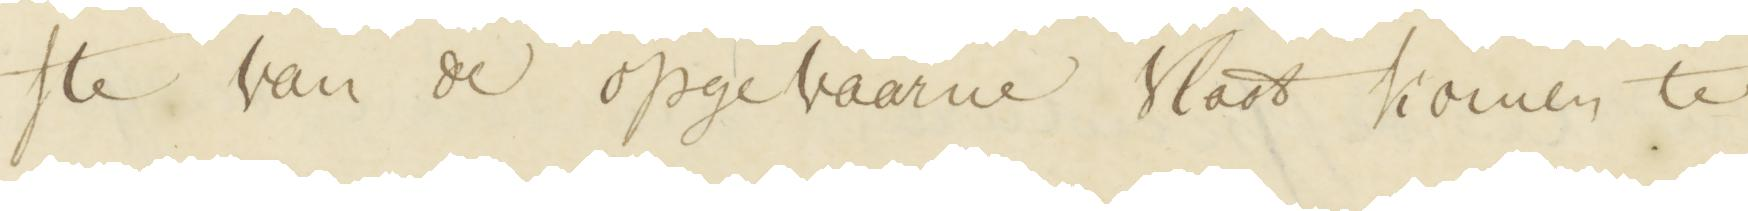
ste van de opgevaarne Vloot komen te
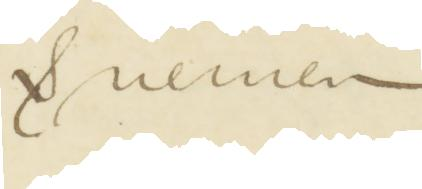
vernemen
